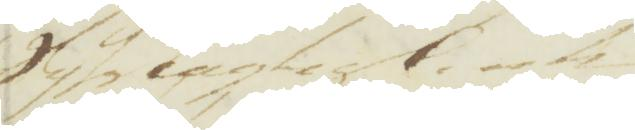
Vijf tagtig Cents
